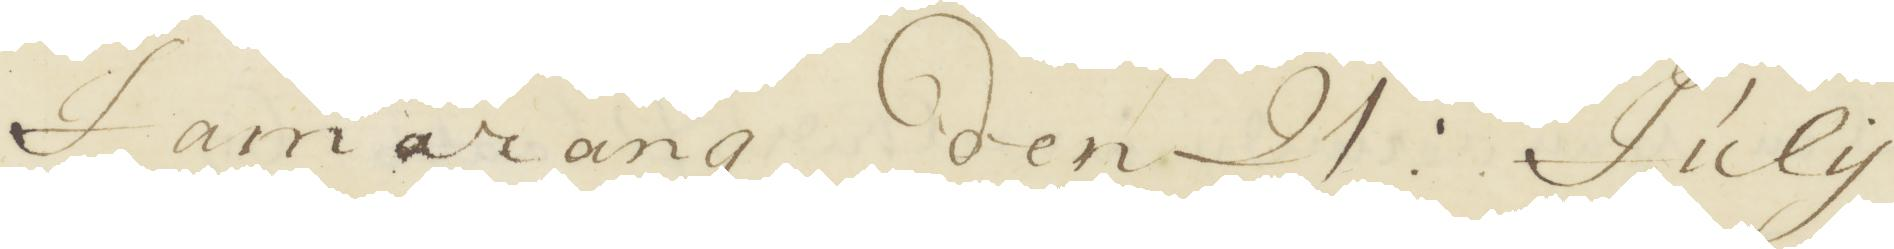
Samarang den 21:' Julij
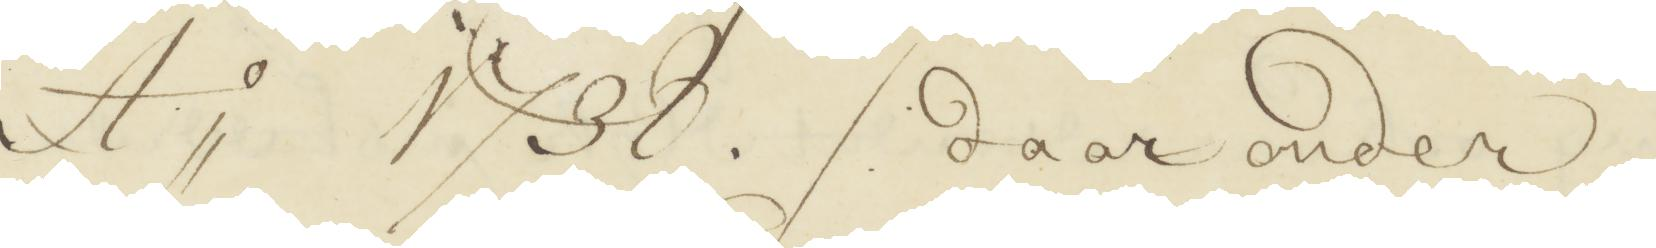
A„o 1738. /:daar onder.
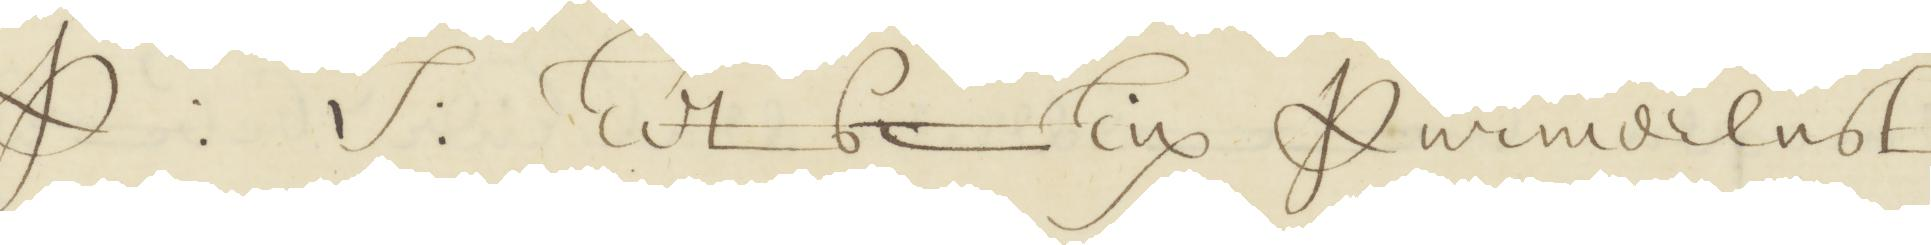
P: S: het schip Purmerlust
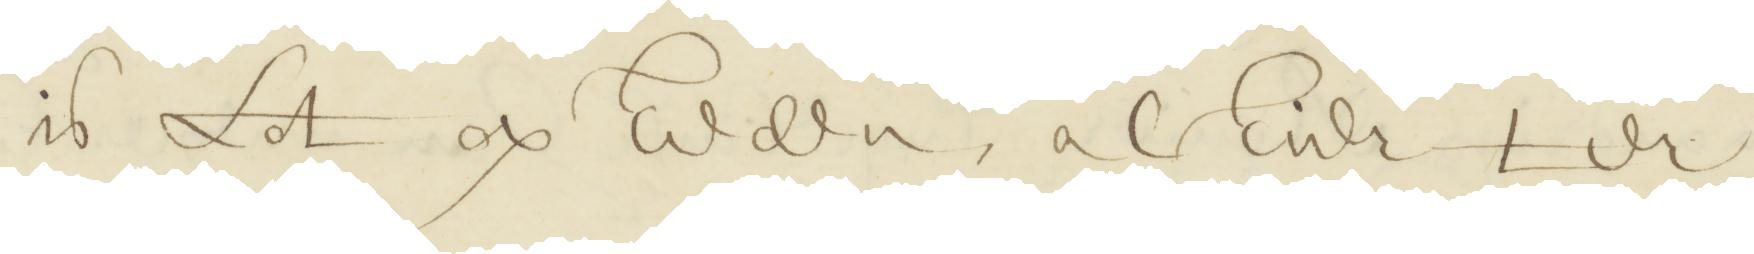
is tot op heden, alhier ter
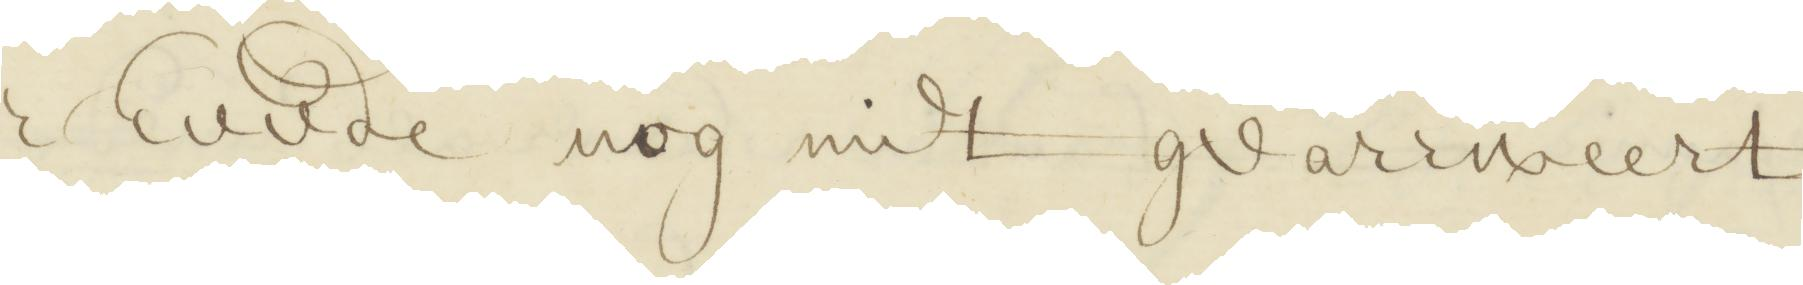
rheede nog niet gearriveert
